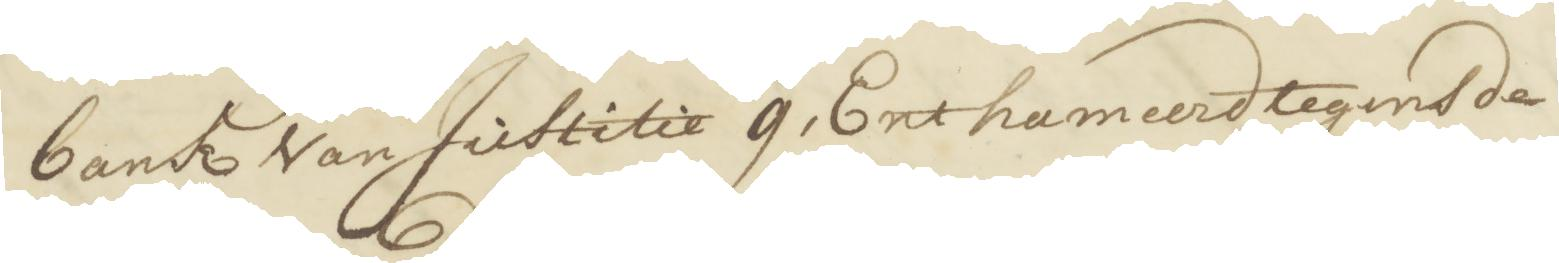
bank van Justitie g,Enthameerd tegens de
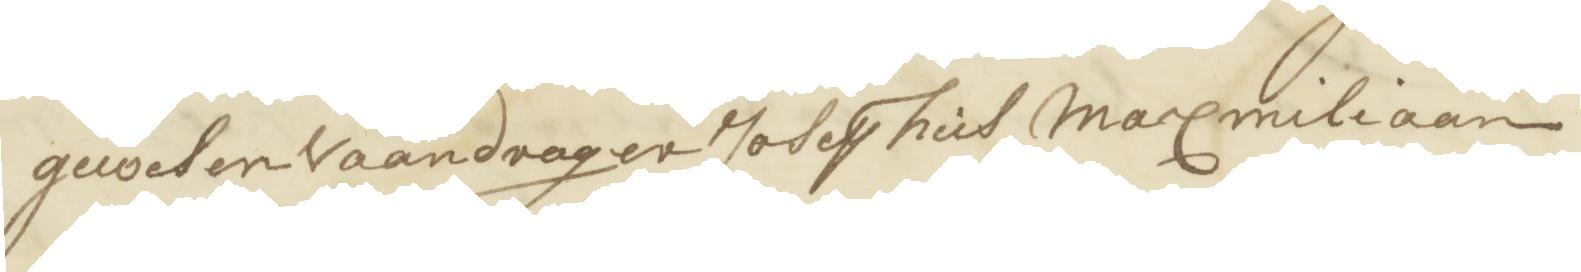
gewesen vaandrager Josephus maxmiliaan
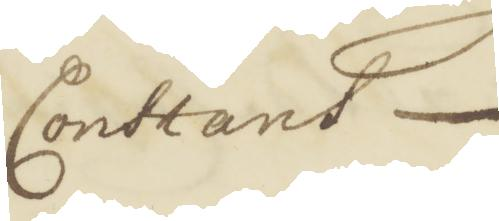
Constans —
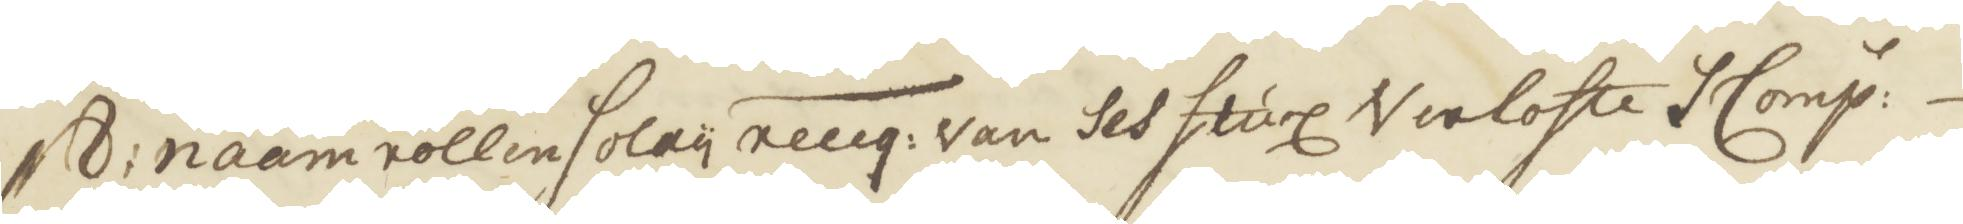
„ 8: naam rollen Soldij reecq: van ses stux verloste ’s Comp:e —
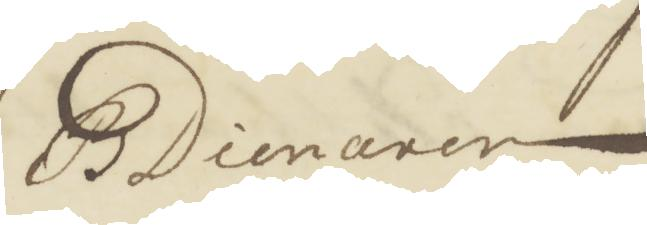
Dienaren
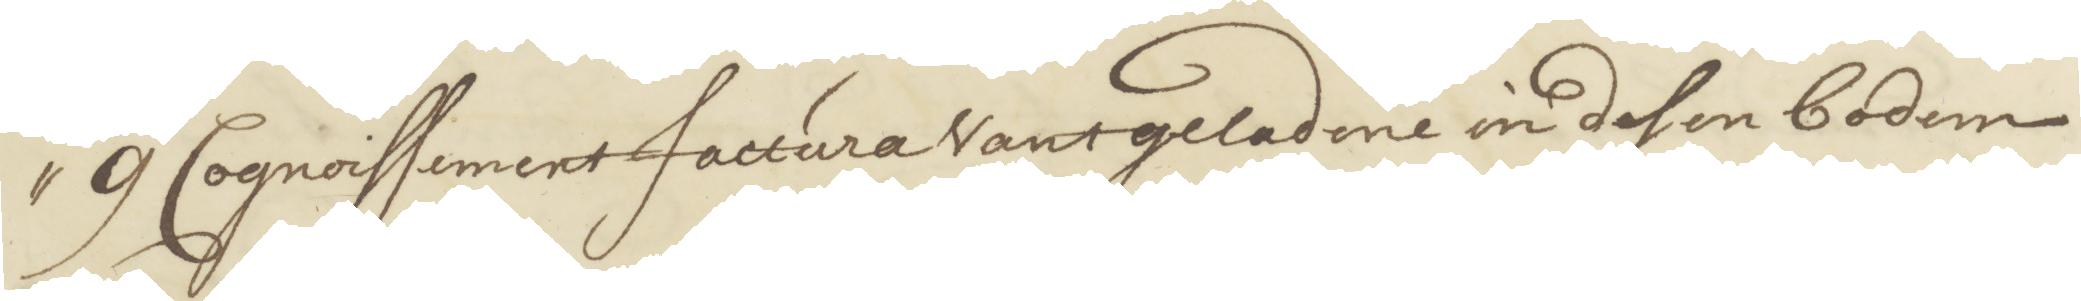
„ 9 Cognoissement factura vant geladene in desen bodem
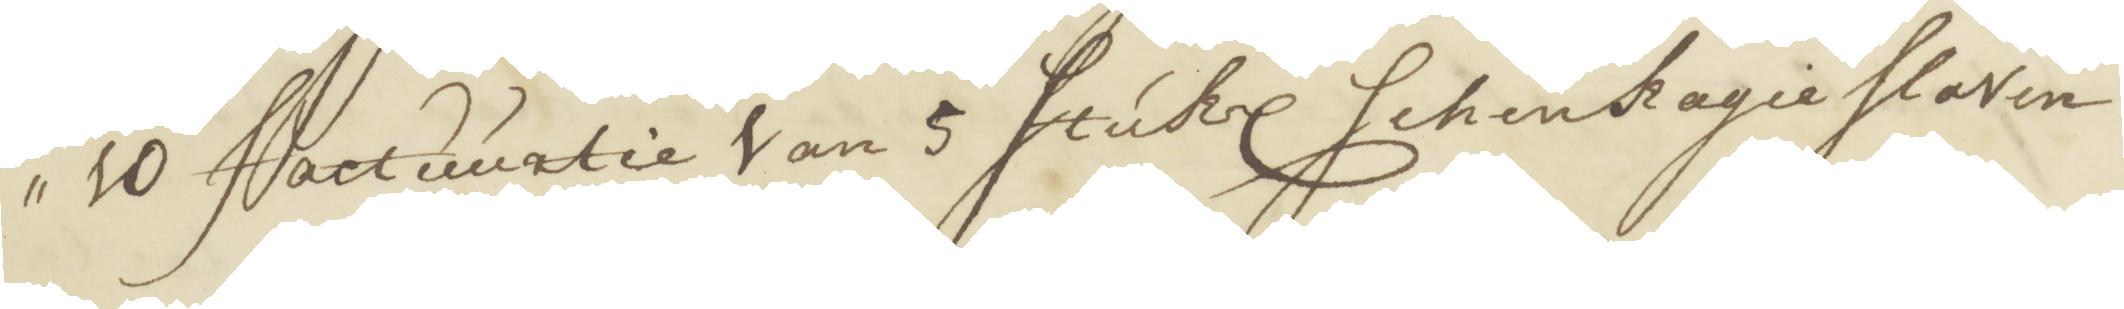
„10 factuurtie van 5 stukx schenkagie slaven
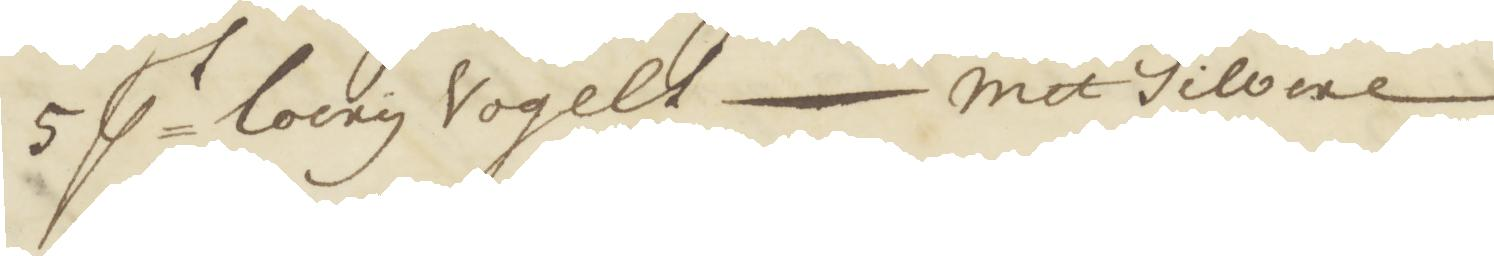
5 p=s loerij Vogels — met silvere
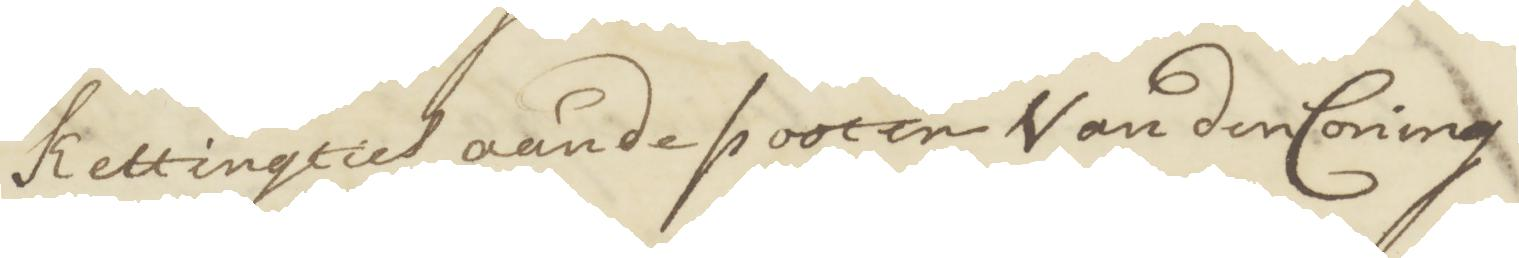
kettingties aan de pooten van den Coning
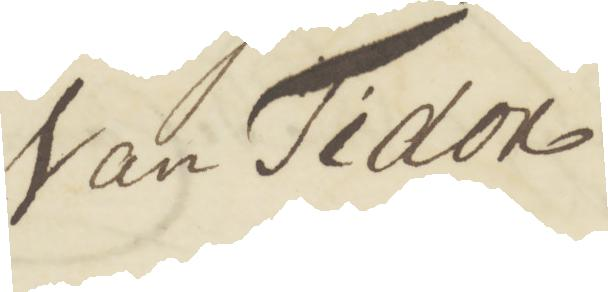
van Tidor
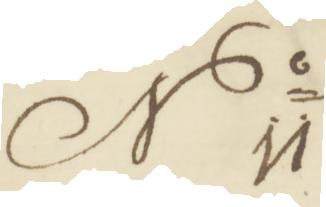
N=o 11
